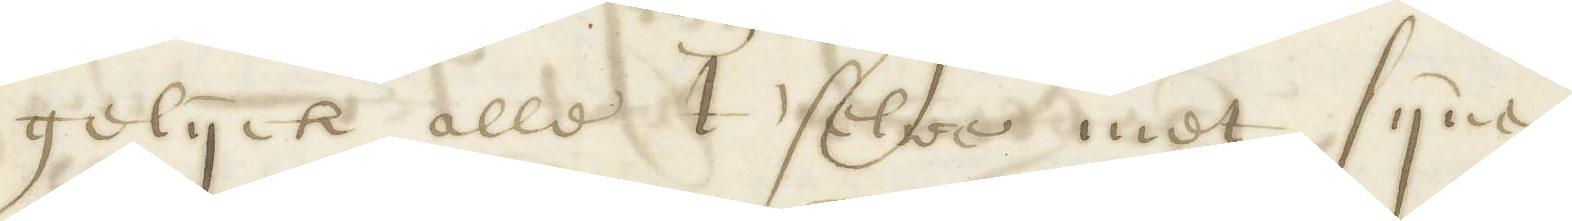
gelijck alle t'selve met sijne
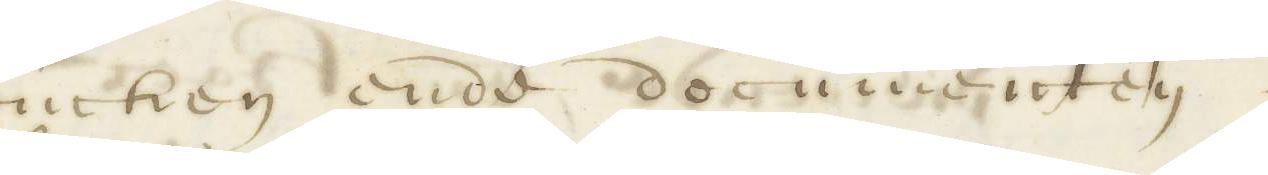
stucken ende documenten
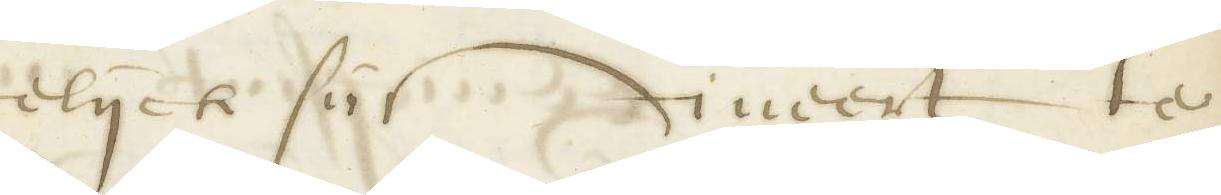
manifestelijck sustineert te
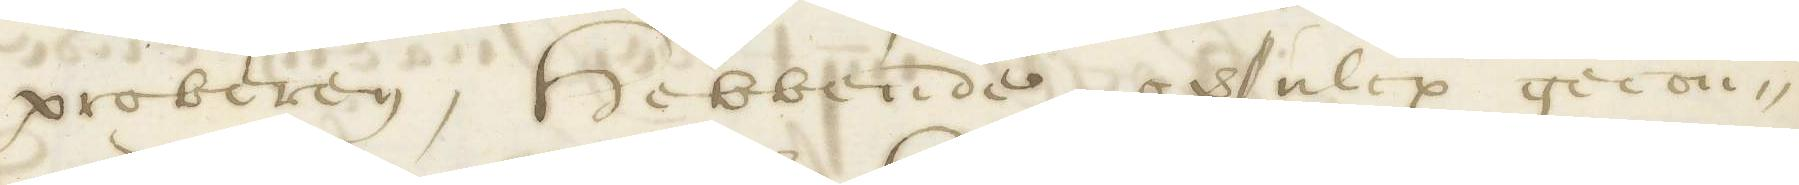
proberen, hebbende oversulcx gecon„
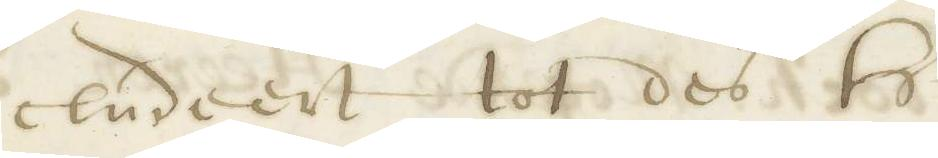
cludeert tot des H
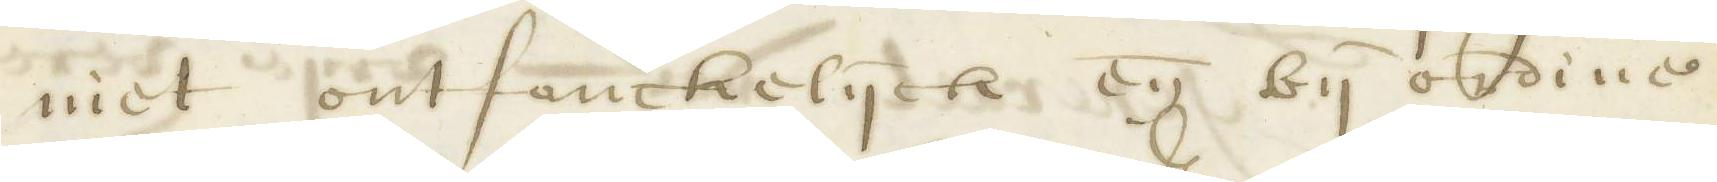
niet ontfanckelijck en bij ordine
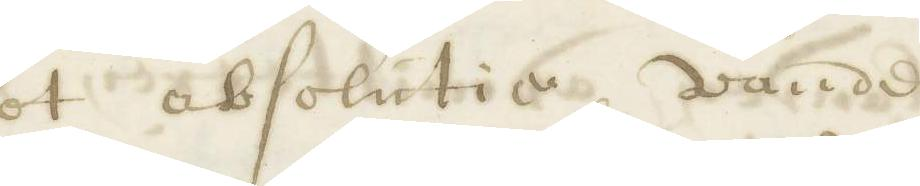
tot absolutie van de
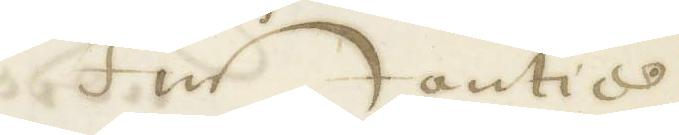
Instantie
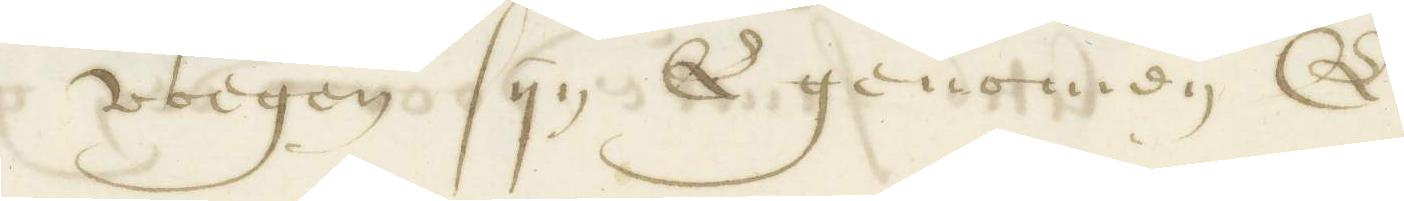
Jn voegen sijn E genomen Eijsch
